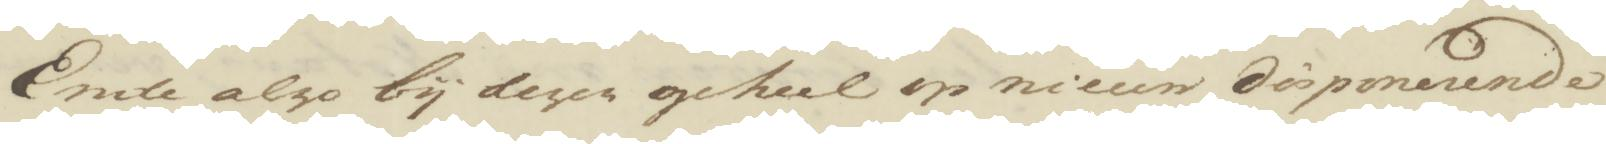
Ende alzo bij dezen geheel op nieuw disponerende
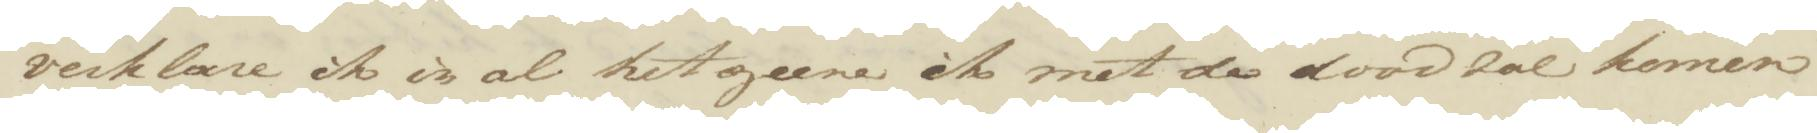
verklare ik in al het geene ik met de dood zal komen
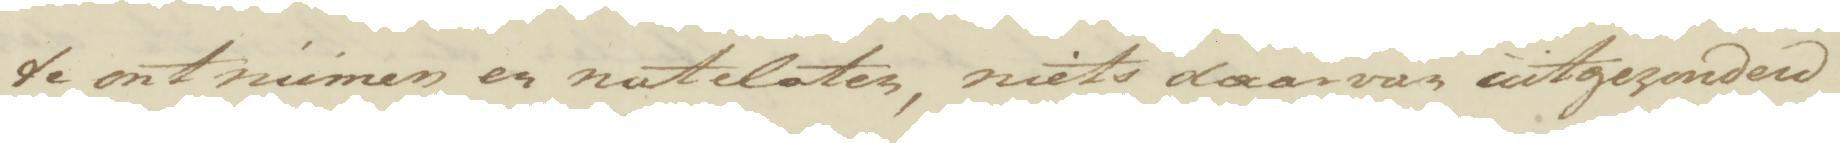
te ontruimen en natelaten, niets daar van uitgezonderd
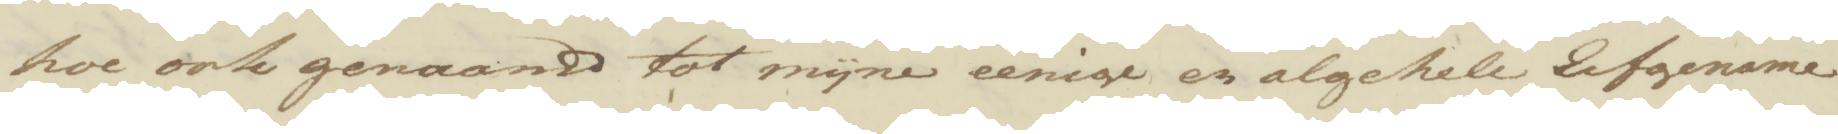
hoe ook genaamd tot mijne eenige en algehele Erfgename
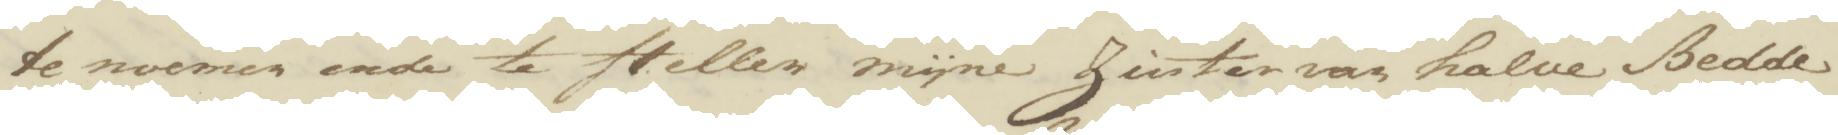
te noemen ende te stellen mijne Zuster van halve Bedde
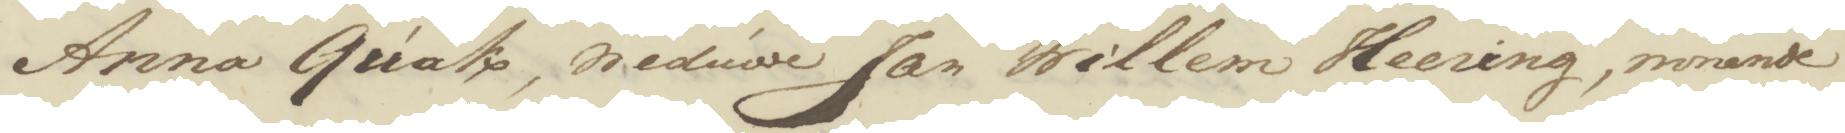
Anna Quak, weduwe Jan Willem Heering, wonende
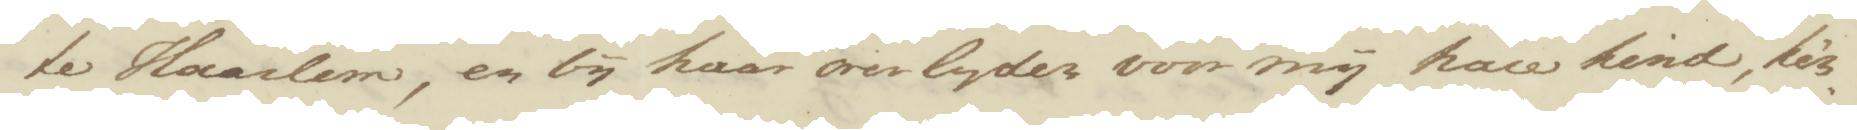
te Haarlem, en bij haar overlyden voor mij hare kind, kin„
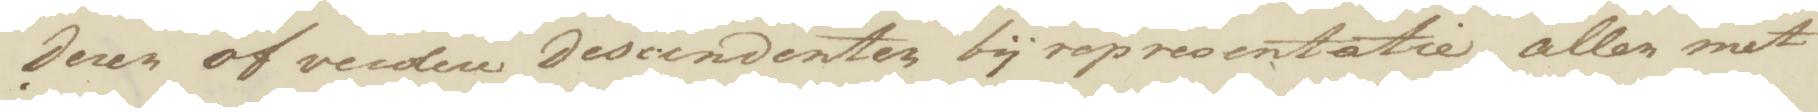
.deren of verdere descendenten bij representatie, allen met
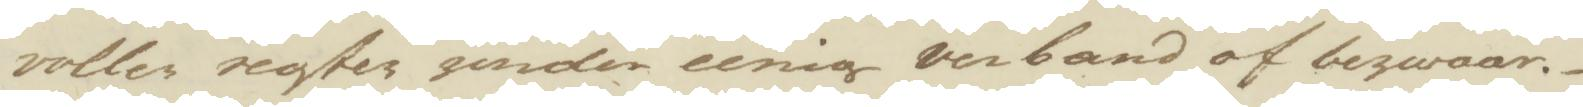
vollen regten zonder eenig verband of bezwaar.
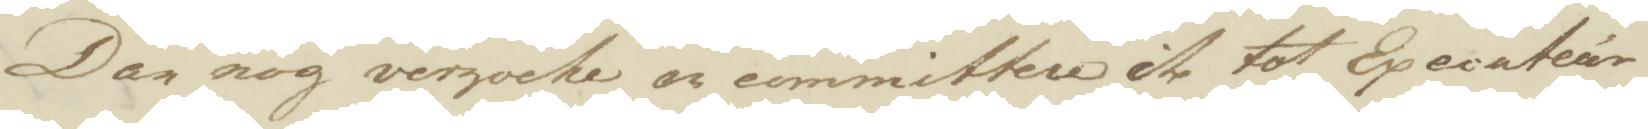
Dan nog verzoeke en committere ik tot Executeur
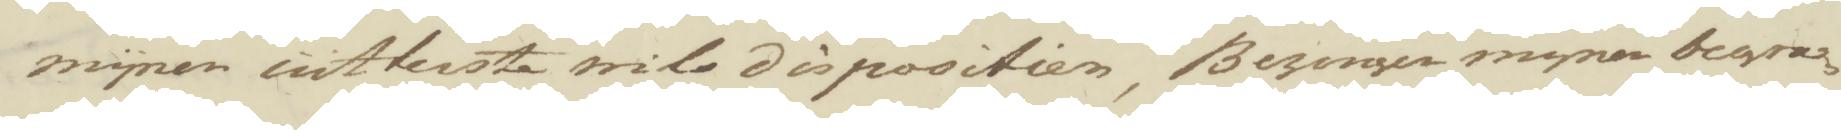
mijner uitterste wils dispositien, Bezorger mynen begrae
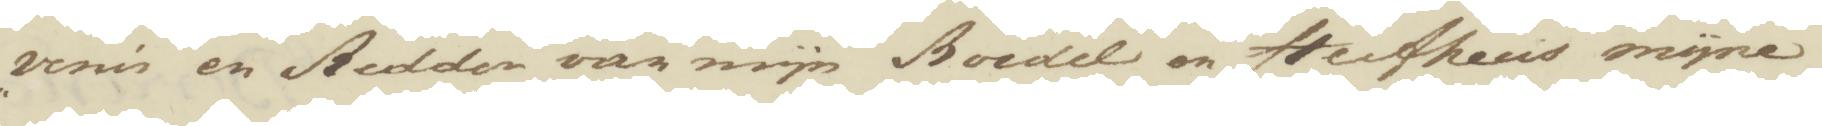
venis en Redder van mijn Boedel en sterfhuis mijne
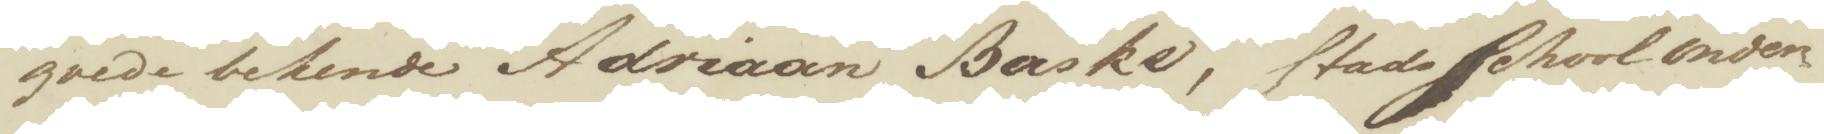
goede bekende Adriaan Baske, stads school onder
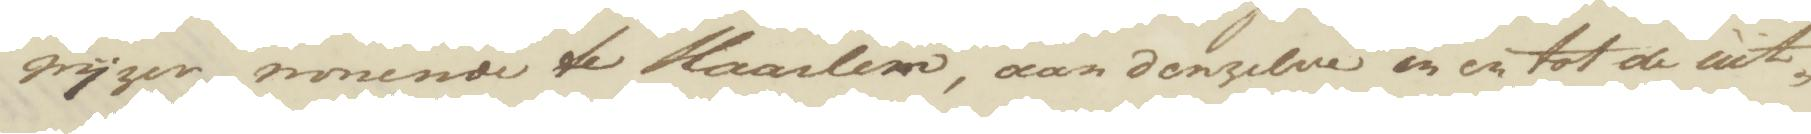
wijzer, wonende te Haarlem, aan denzelve in en tot de uit
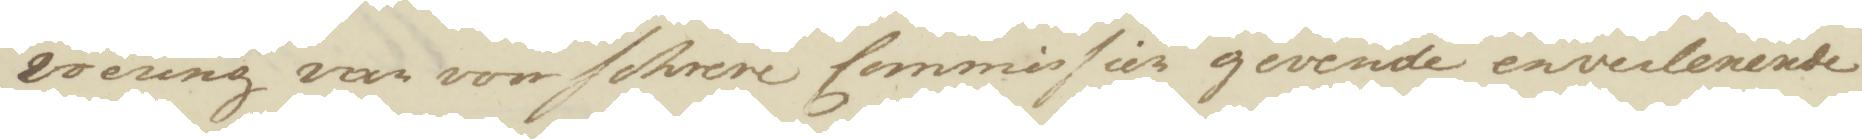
voering van voorschreve Commissien gevende en verlenende
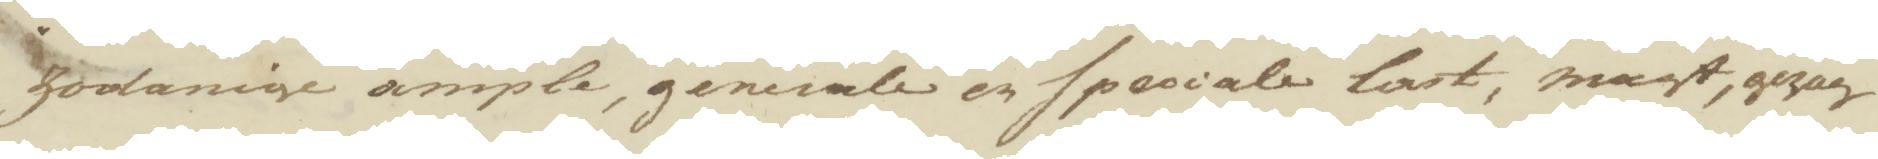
zodanige ample, generale en speciale last, magt, gezag
